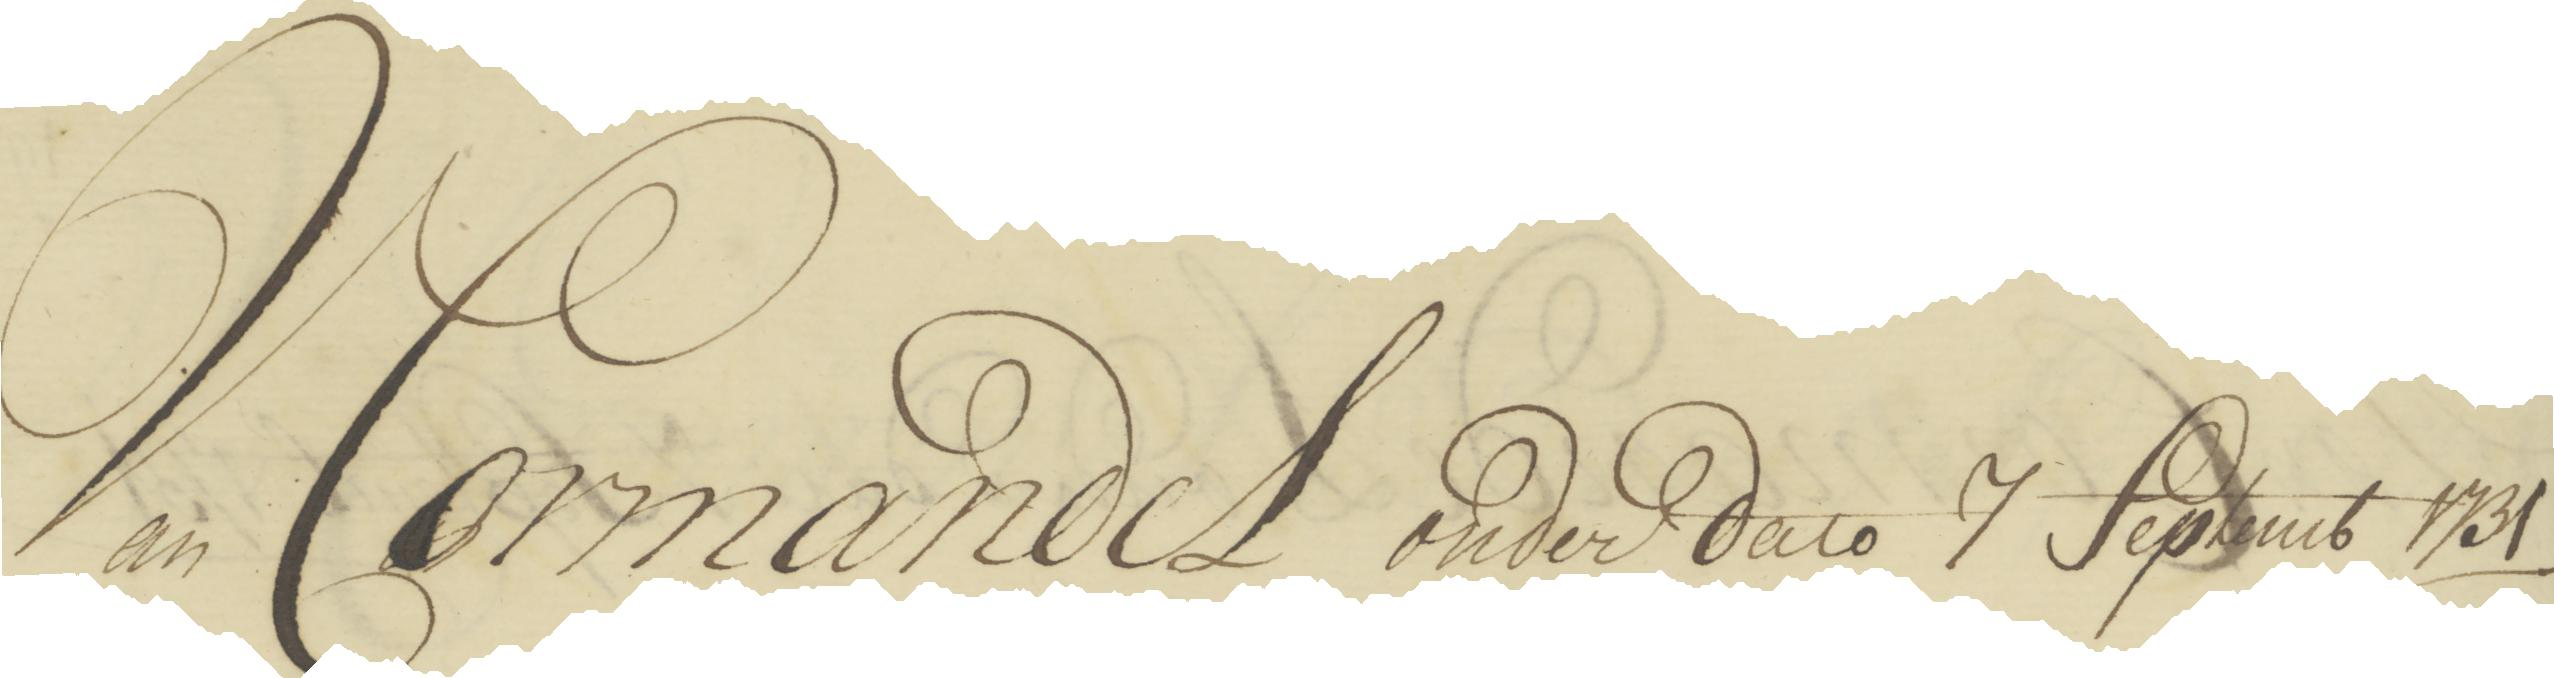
Van Cormandel onder dato 7 Septemb 1731
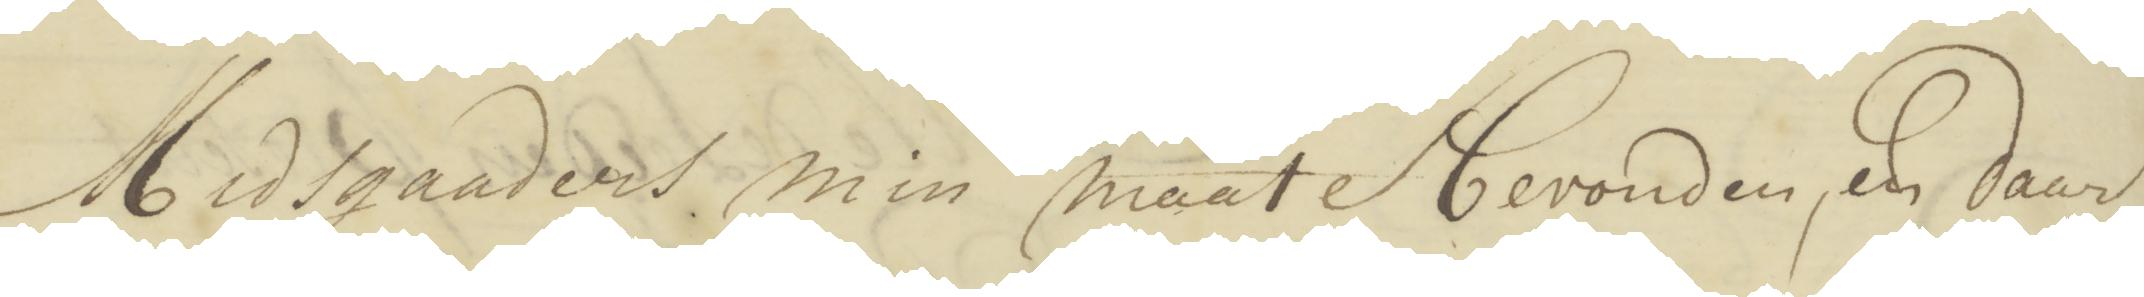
Midsgaaders min maats bevonden, en daar
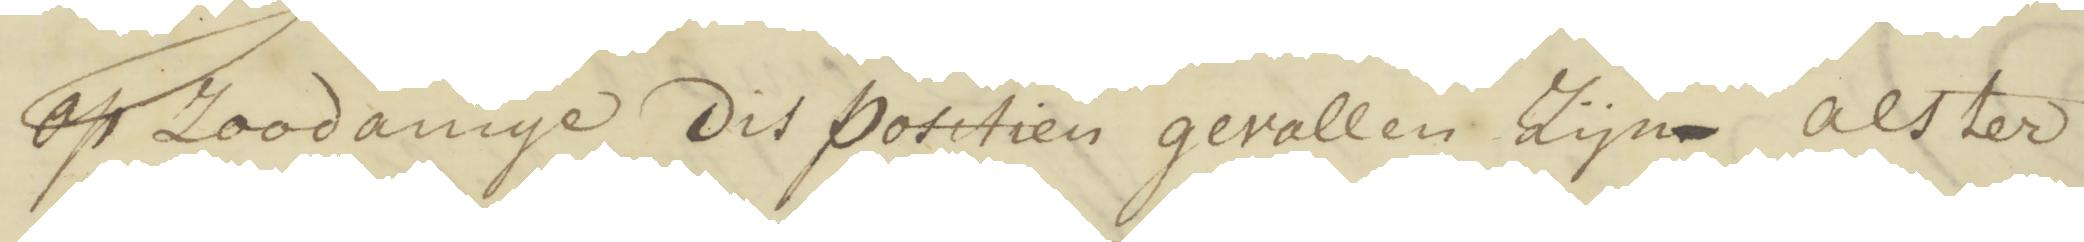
op zoodanige dispositien gevallen zijn als ter
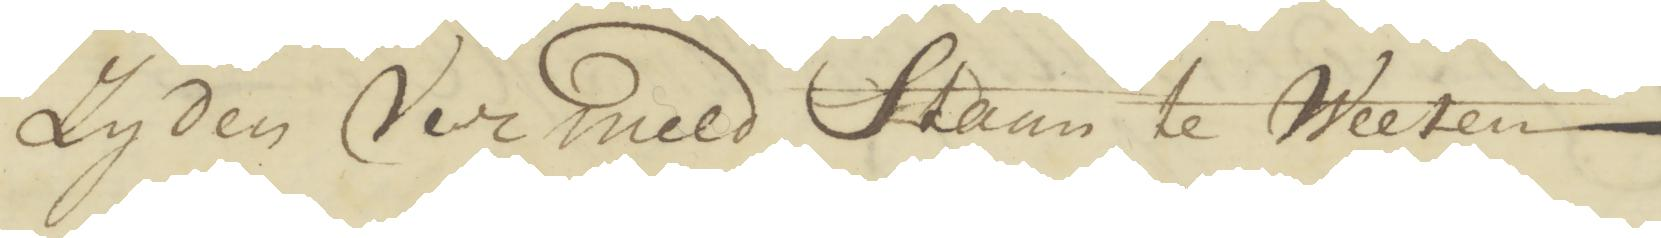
zyden vermeld staan te weeten
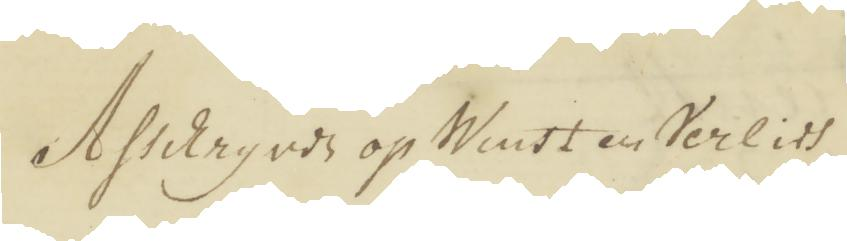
Afschryven op Winst en Verlies
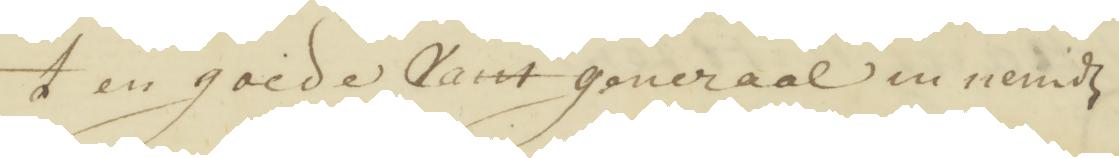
ten goede vant generaal in nemen
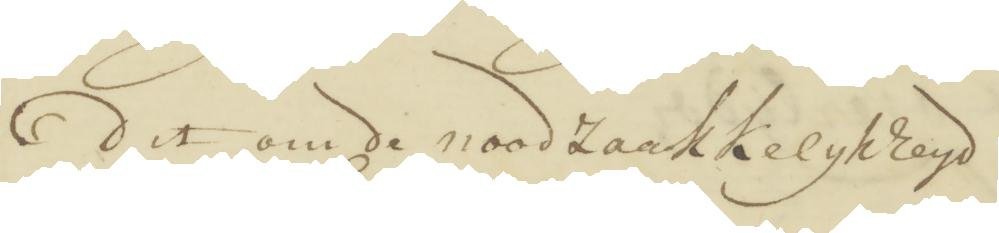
dit om de nood zaakkelykheyd
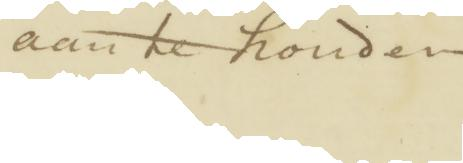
aan te houden
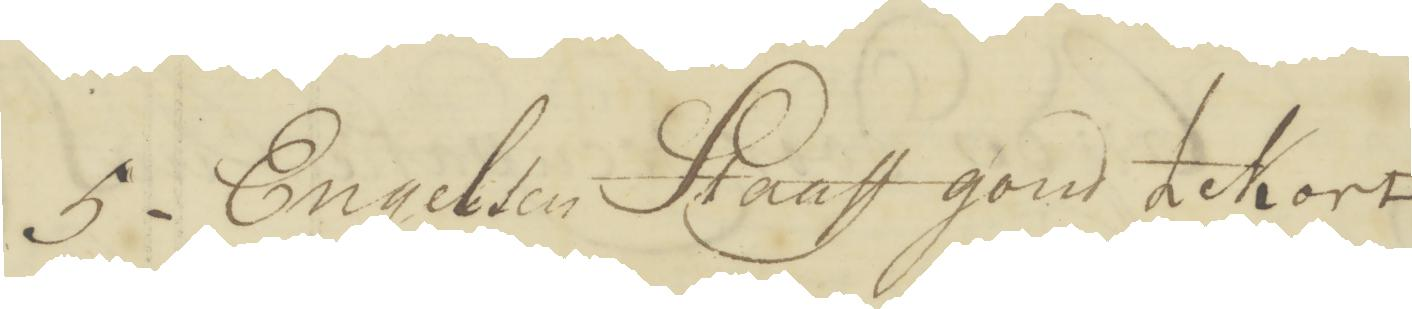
5 - Engelsen Staaff goud tekort
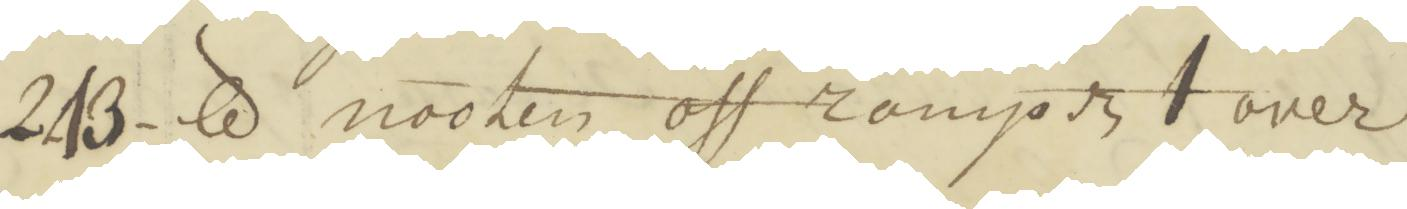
243 - lb nooten off rompen t over
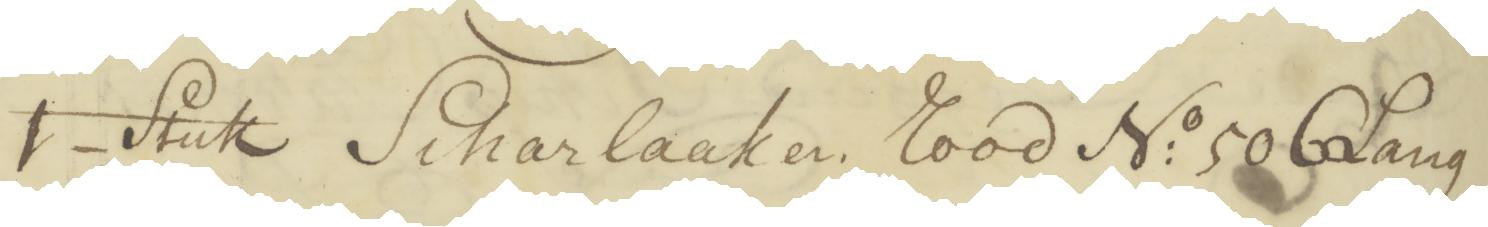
1 - stuk Scharlaaken rood N:o 506 Lang
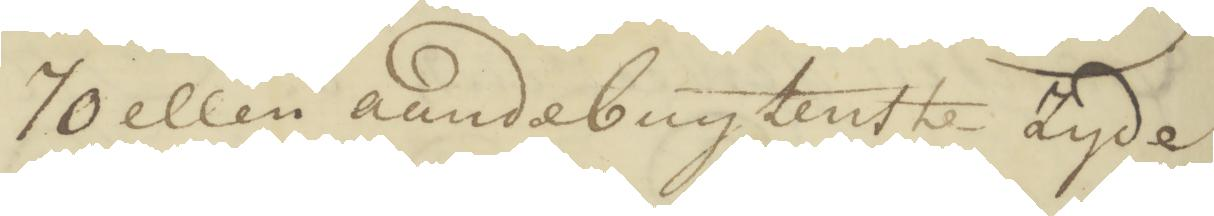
70 ellen aan de buytenstte zyde
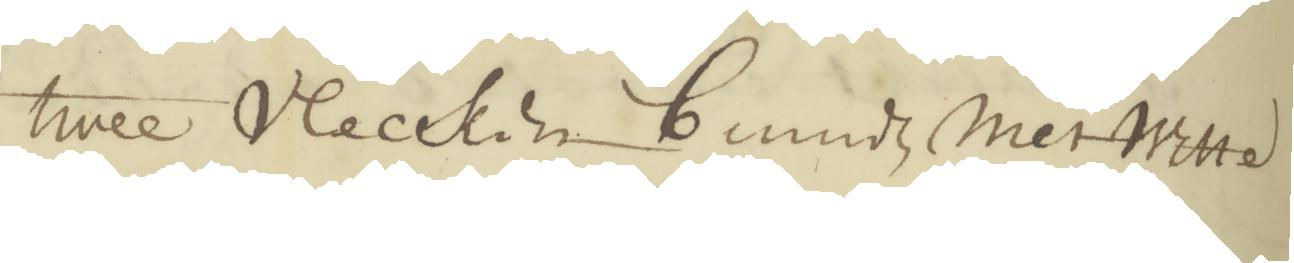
twee vlecken binnen met witte
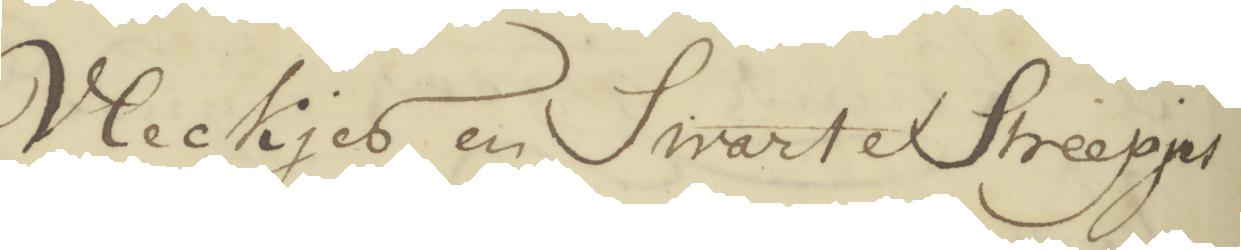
Vleckjes en Swarte Streepjes
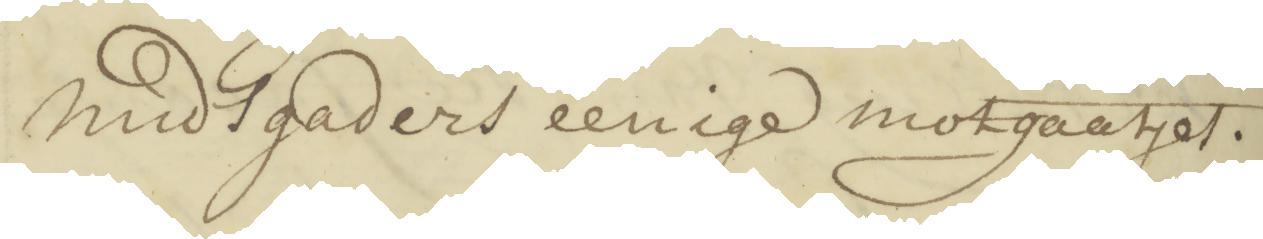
midsgaders eenige motgaatjes.
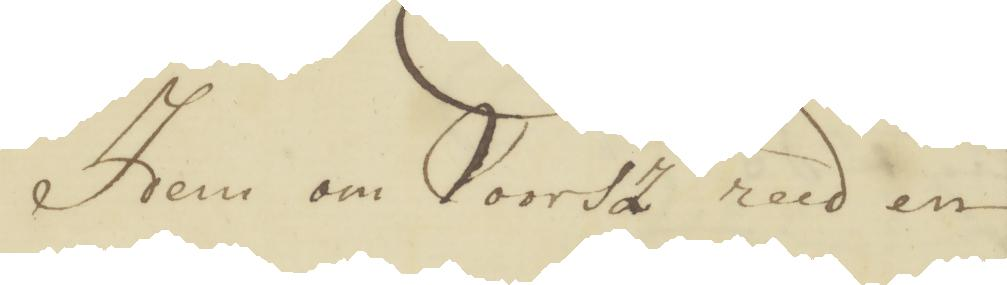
Idem om Voorsz reed en
